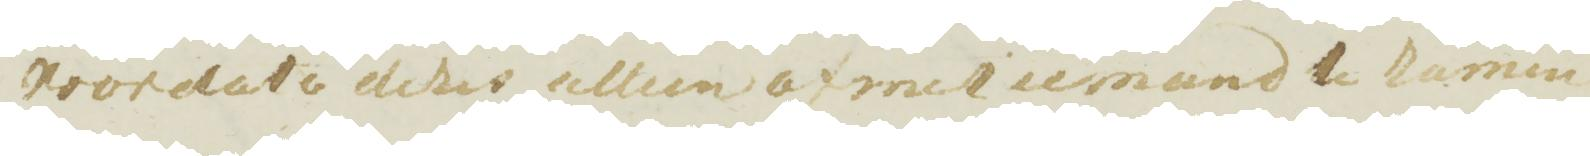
voor dato dezes alleen of met iemand te zamen
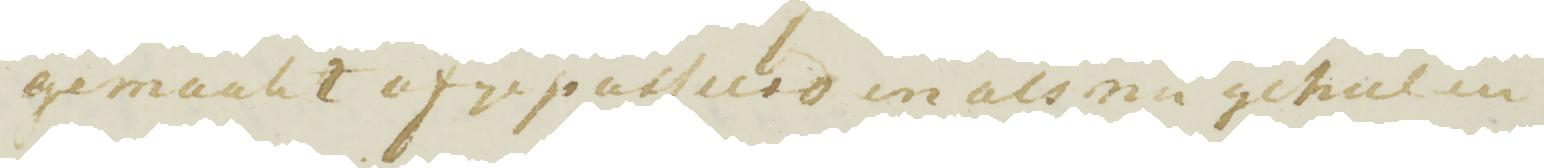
gemaakt of gepasseerd en als nu geheel en
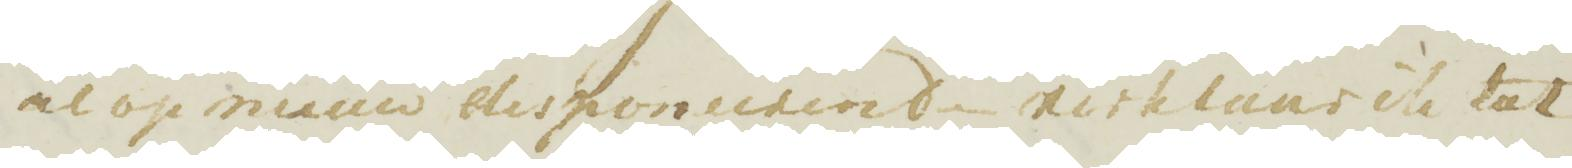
al op nieuw disponeerend en verklaar ik tot
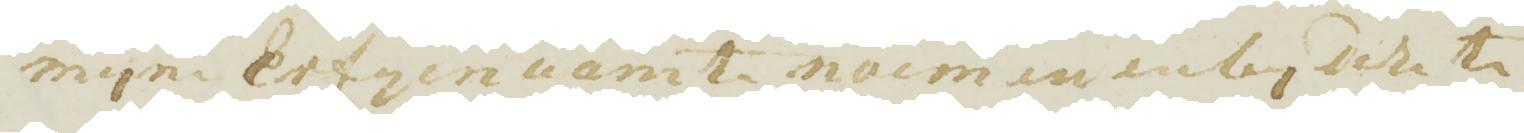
mijne Erfgenaam te noemen en by deze te
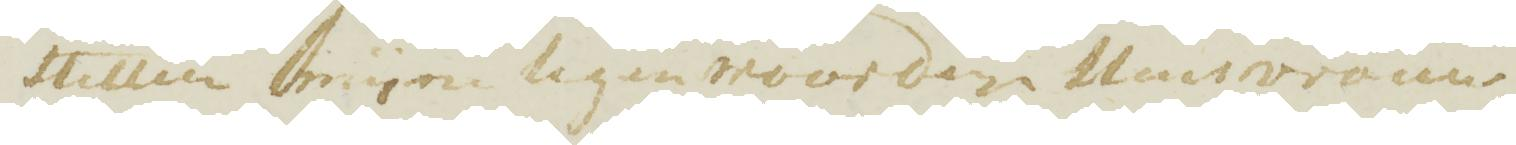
stellen mijne tegenwoordigen Huisvrouw
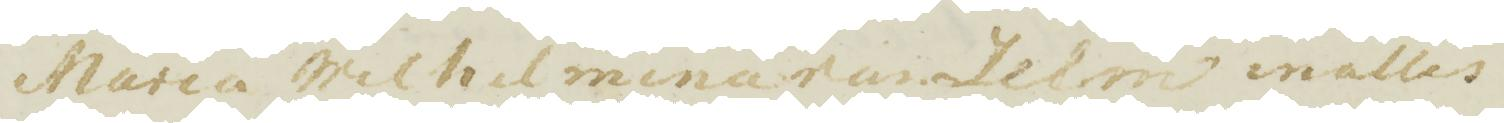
Maria Wilhelmina van Zelm in alles
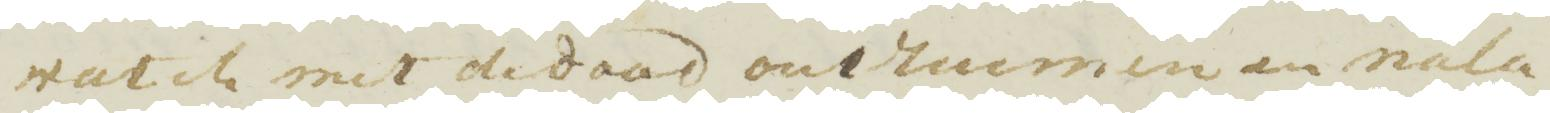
wat ik met de dood ontruimen en nala
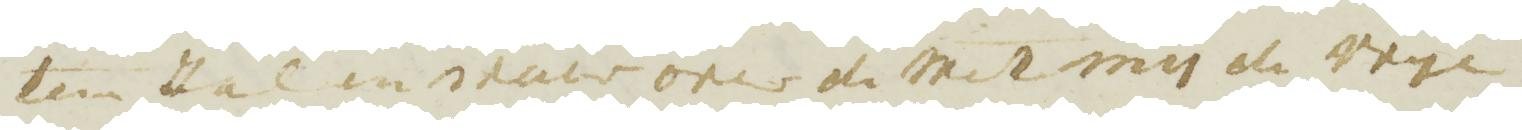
ten zal en waerover de wet mij de vrye
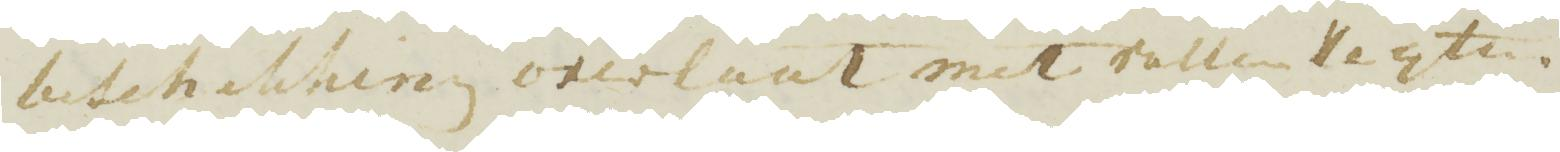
beschikking overlaat met vollen regten.
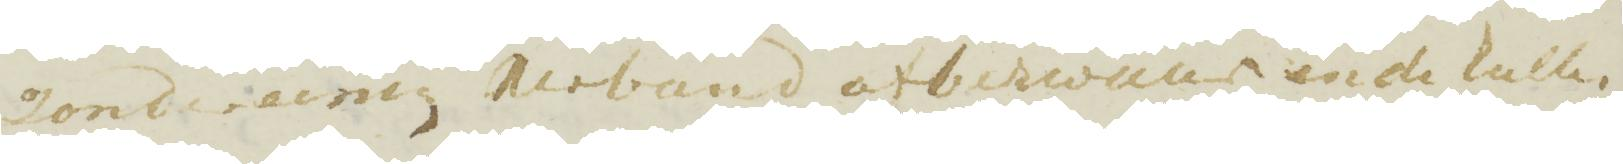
zonder eenig verband of bezwaar en de zulks
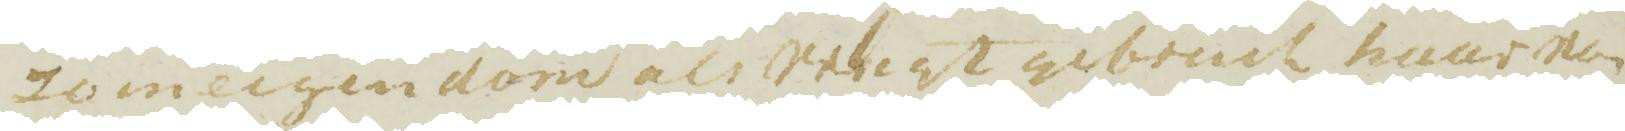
zo in eigendom als vrugt gebruik haar van
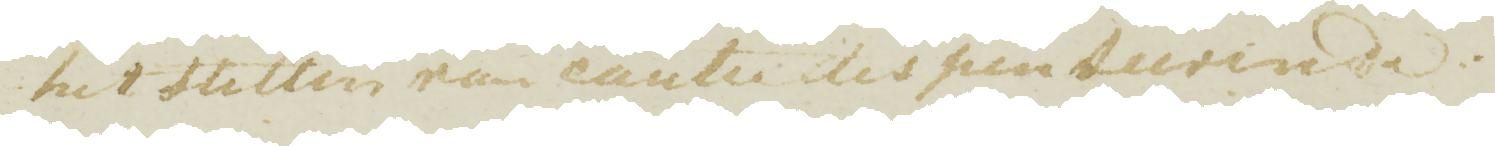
het stellen van cautie despendeerende.
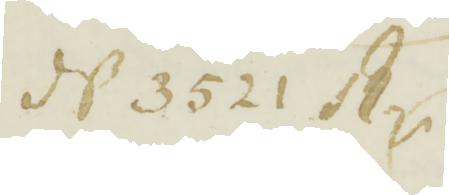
No 3521 Rv
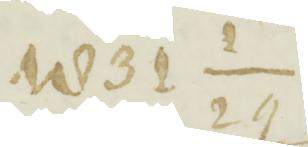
1831 1/29
